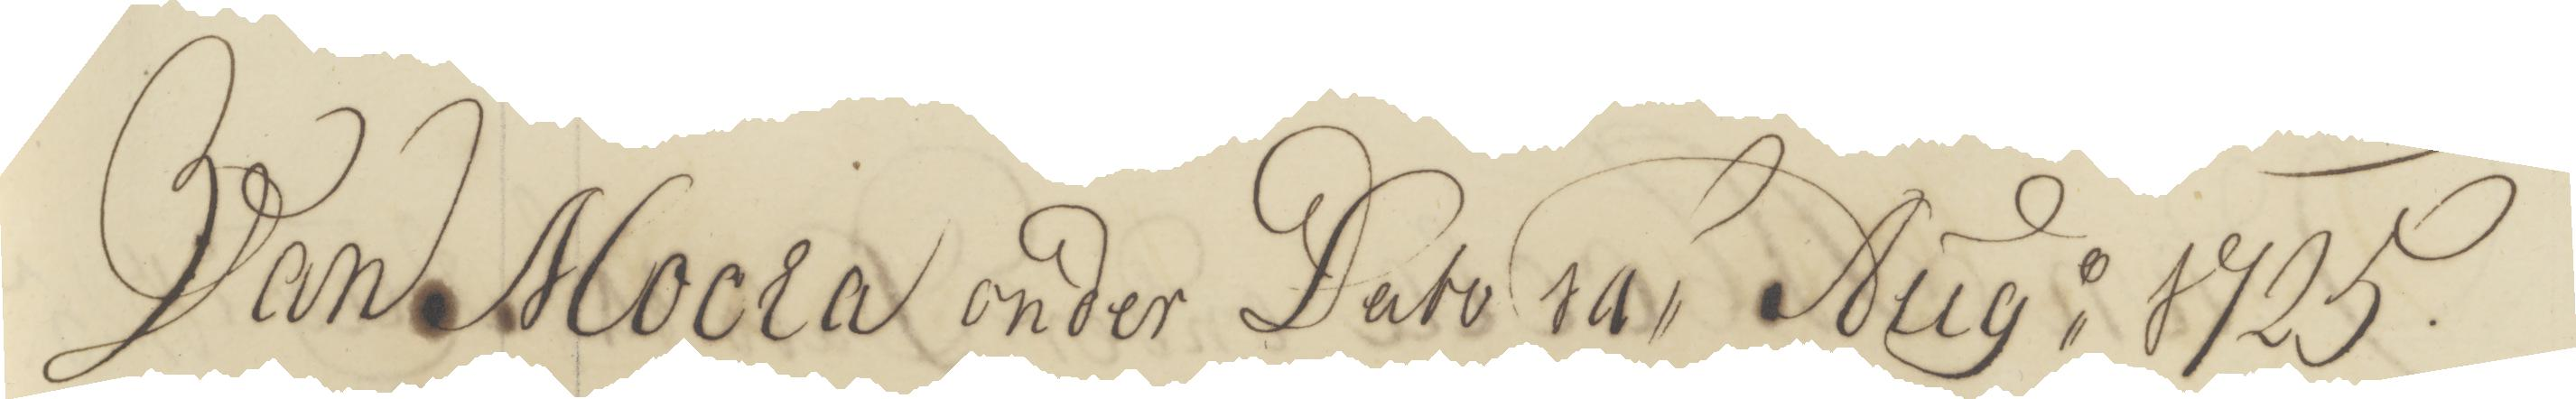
Van Mocha onder Dato 14„' Aug„o 1725.
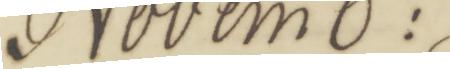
Novemb:r
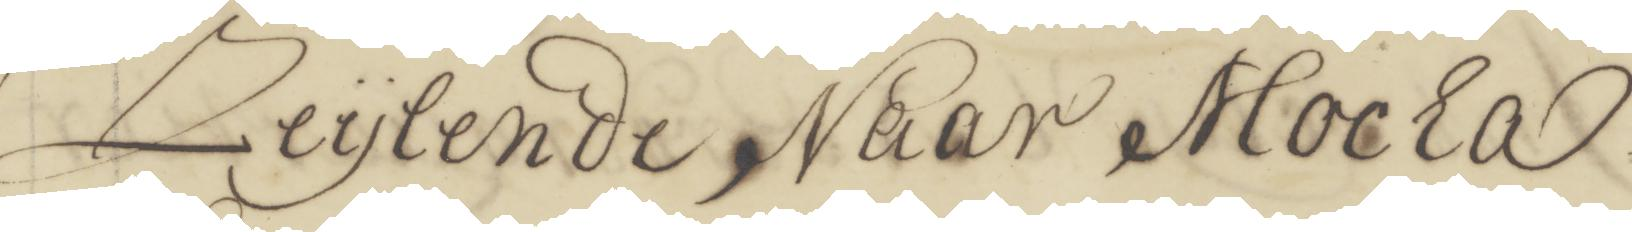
Zeijlende Naar Mocha
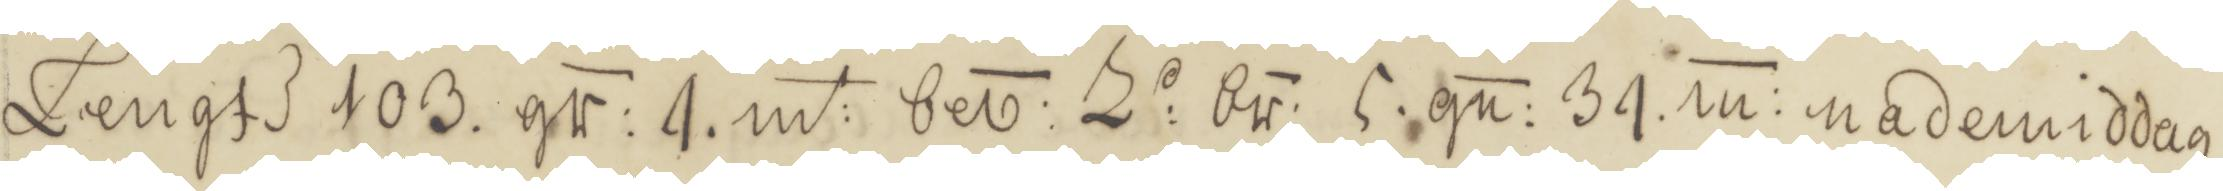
Lengte 103. gr: 4. m:t bev: Z:d br: 5. gr: 34. m: na demiddag
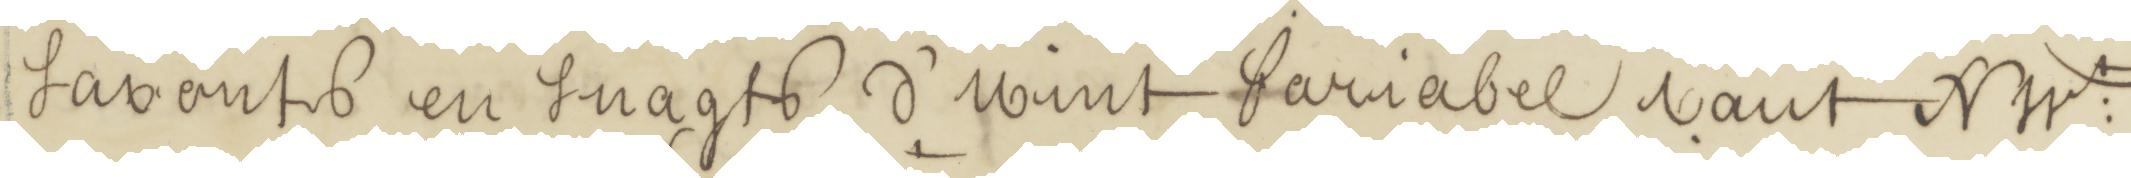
savonts en snagts d’ wint fariabel vant NW:t
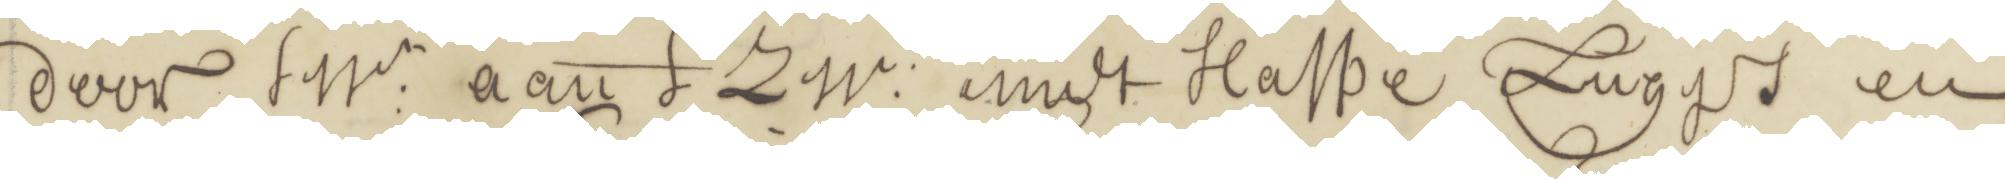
door 1 t W:r aan t ZW:t met slappe Lugjes en
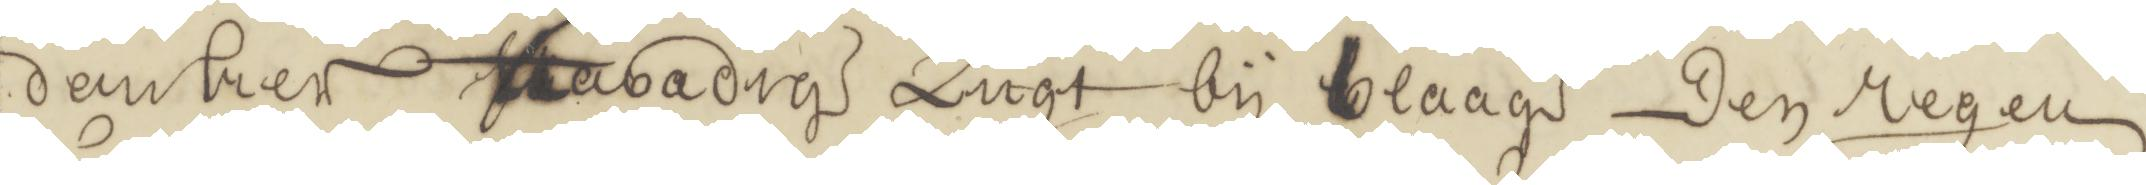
donker kwadige Lugt bij vlaage Een regen
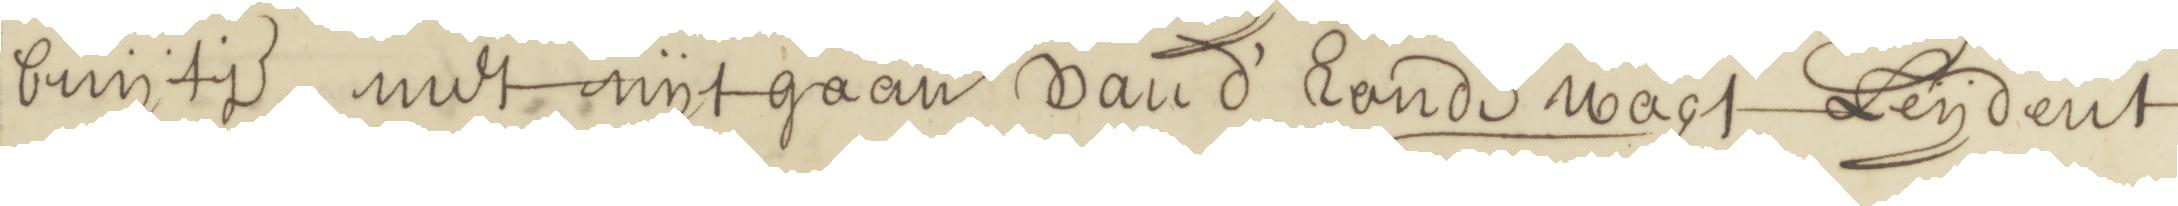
buijtje, met uijtgaan van d’ honde wagt Leijdent
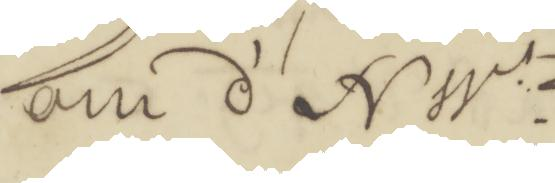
om d’ N W:t
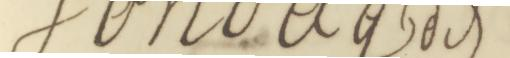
Sondag den
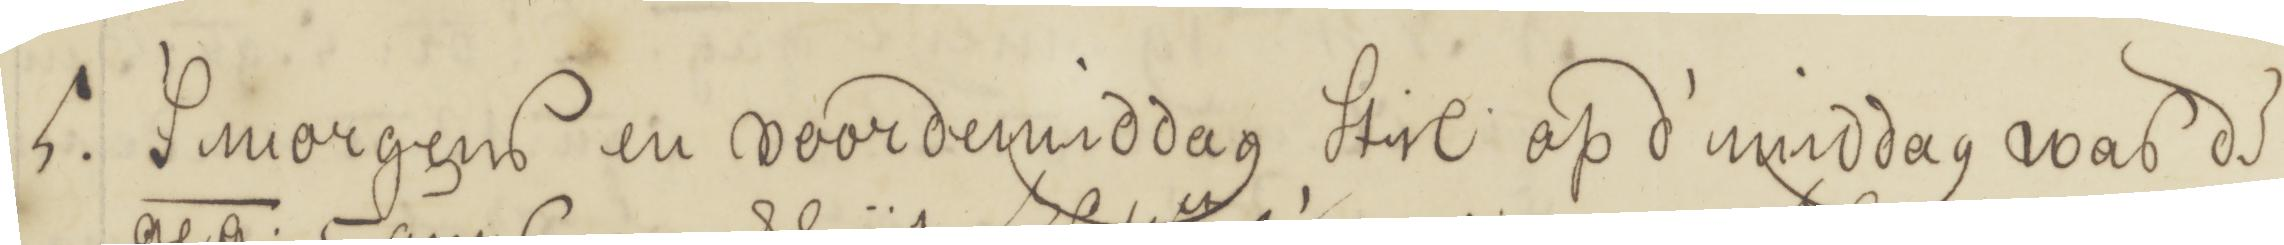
5. 'S morgens en voor demiddag stil op d’ middag was de
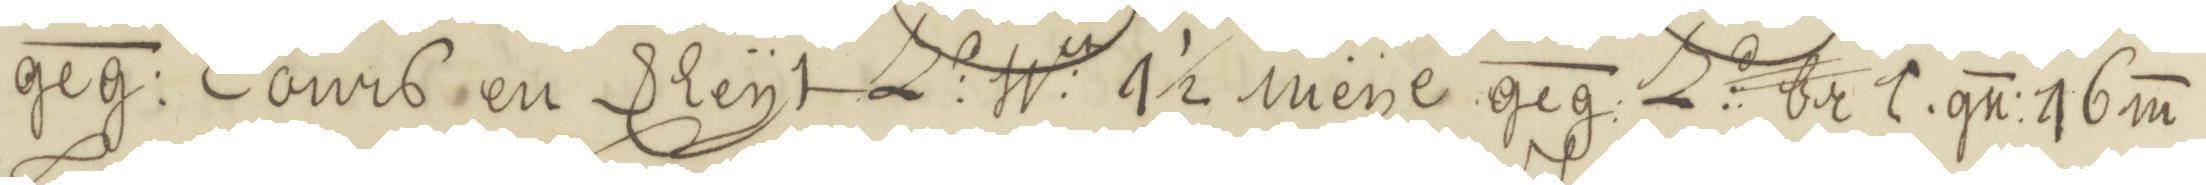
geg: cours, en verheijt Z:d W:t 4½ meijl geg: Z:d br 5. gr: 46 m
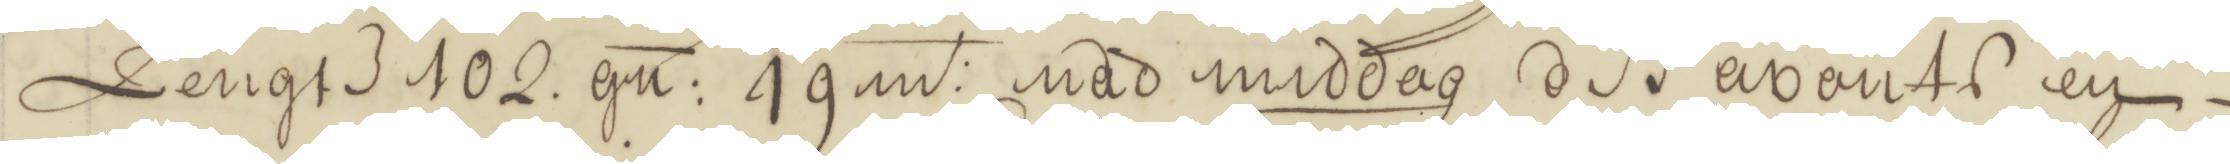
Lengte 102. gr: 49 m:t nad middag des avants en
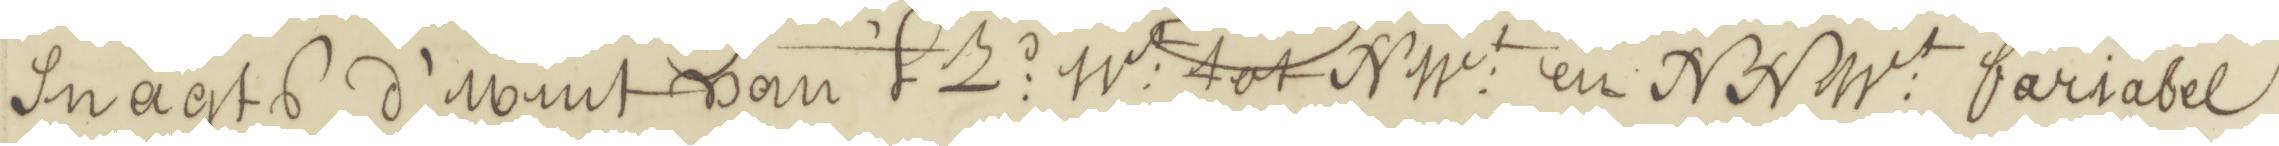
snagts d’ wint van ’t Z:d W:t tot NW:t en NNW:t fariabel
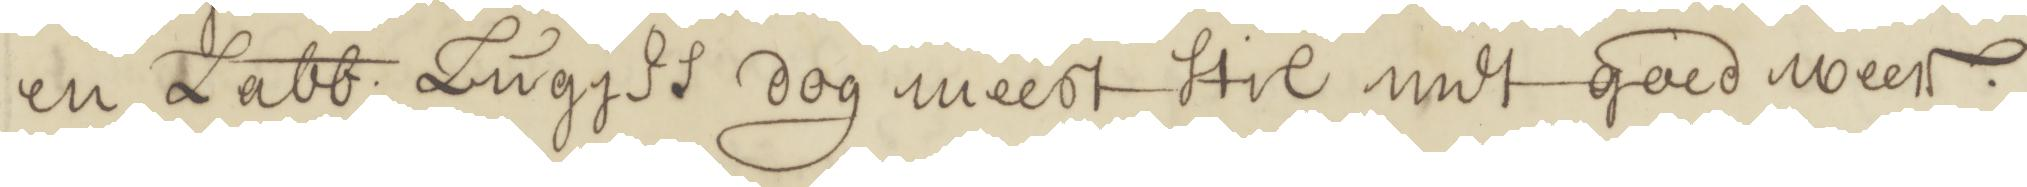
en Labb: Lugjes dog meest stil met goed weer.
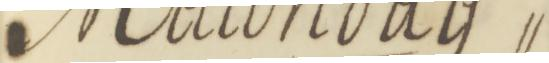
Maandag „
